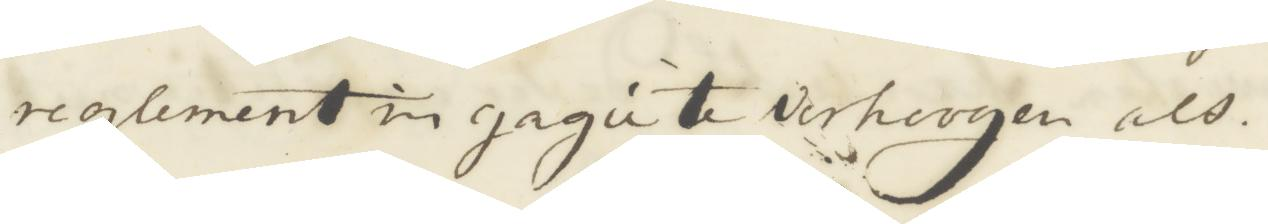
reglement in gagie te verhoogen als.
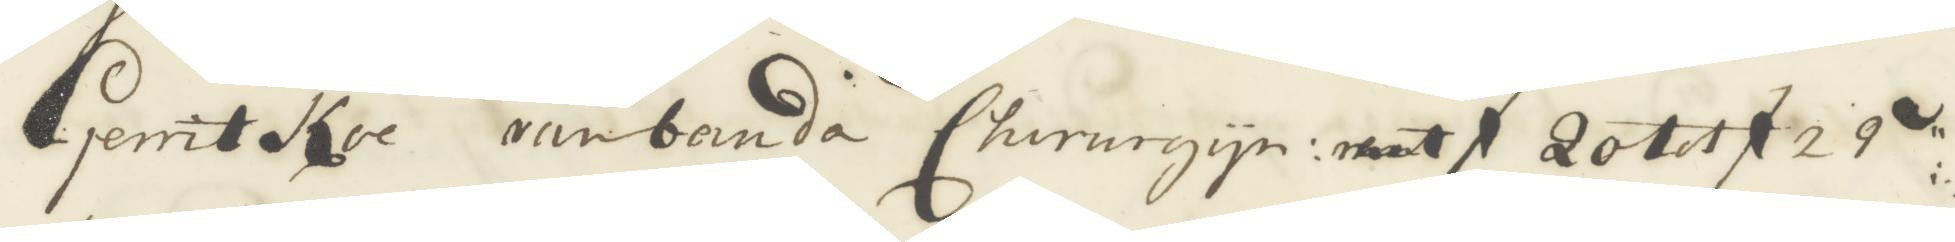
Gerrit Koe van banda chirurgijn: vant ƒ 20 tot ƒ 29
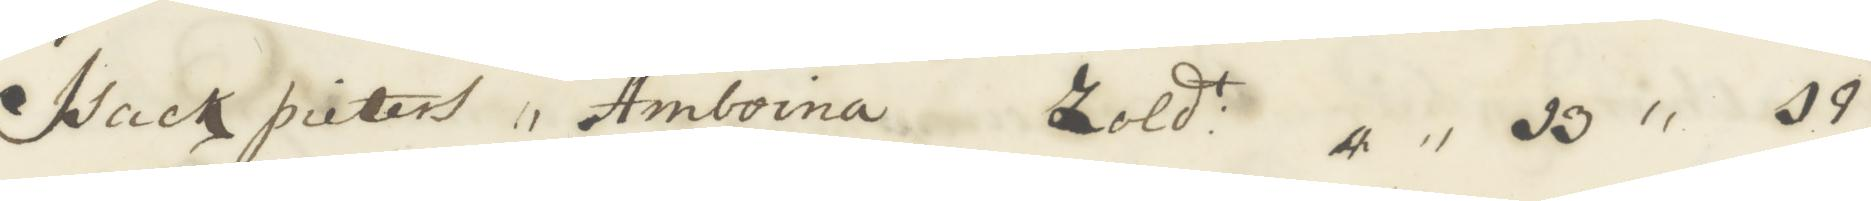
Isack pieters „ Amboina zold:t „ „ 13 „ 19
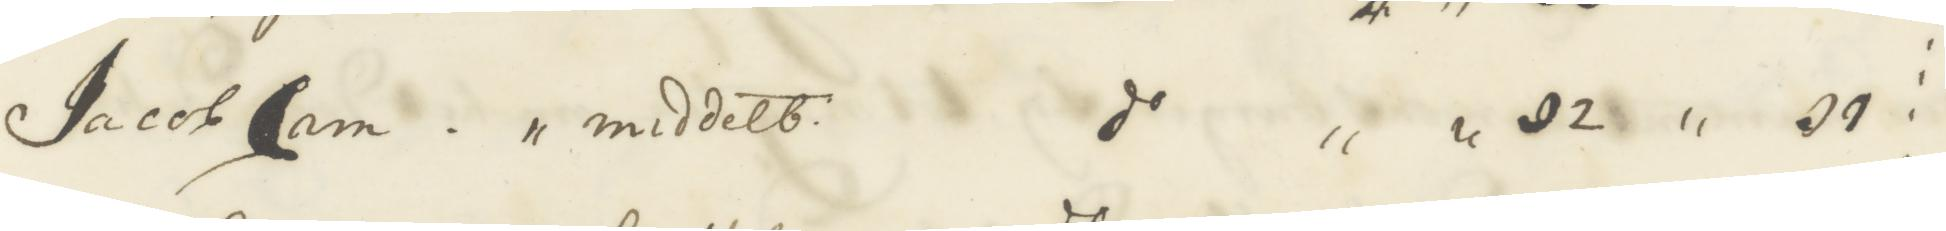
Jacob Cam . „ middelb: do „ „ 12 „ 14:
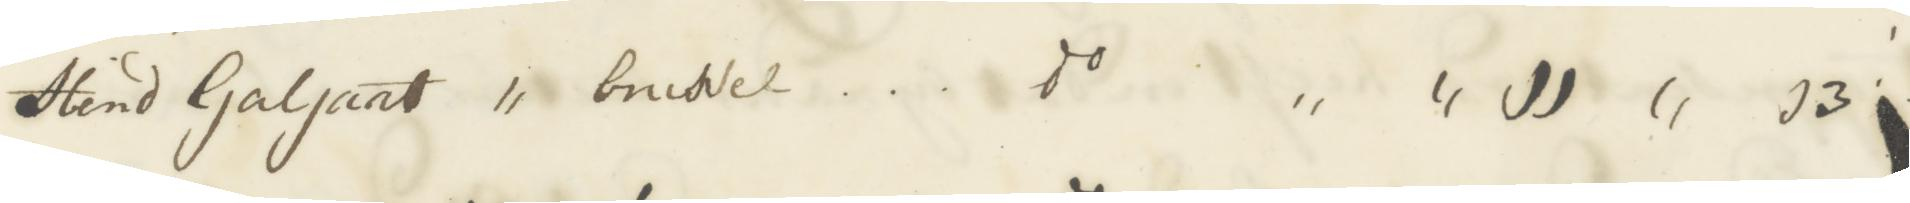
Hend Galjaat „ brussel . . . do „ „ 11 „ 13
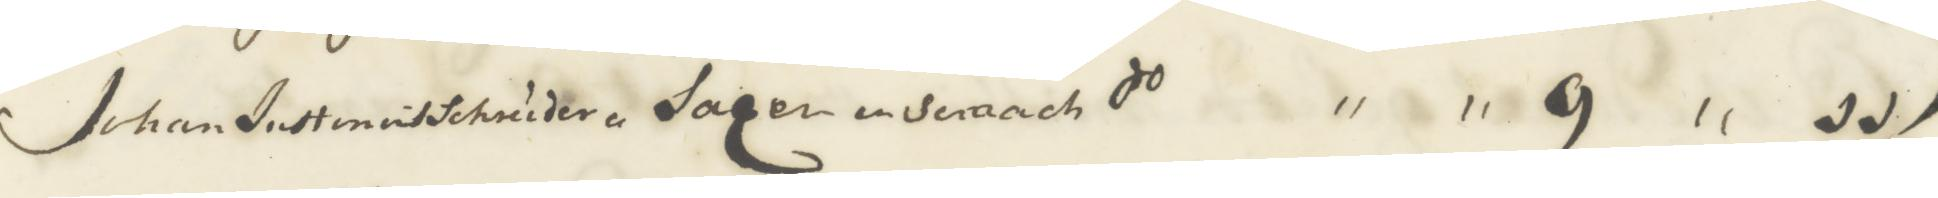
Johan Iustinus schruder „ Saxen in seraach do „ „ 9 „ 11
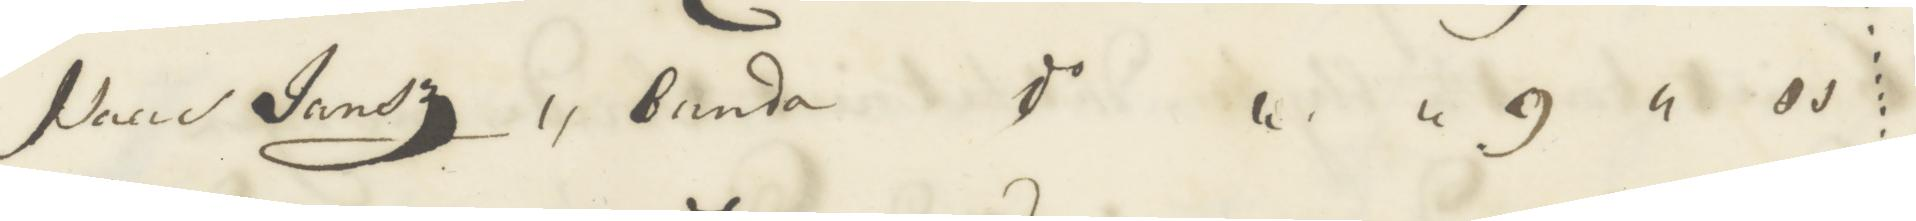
Jsaac Iansz „ banda do „ „ 9 „ 11
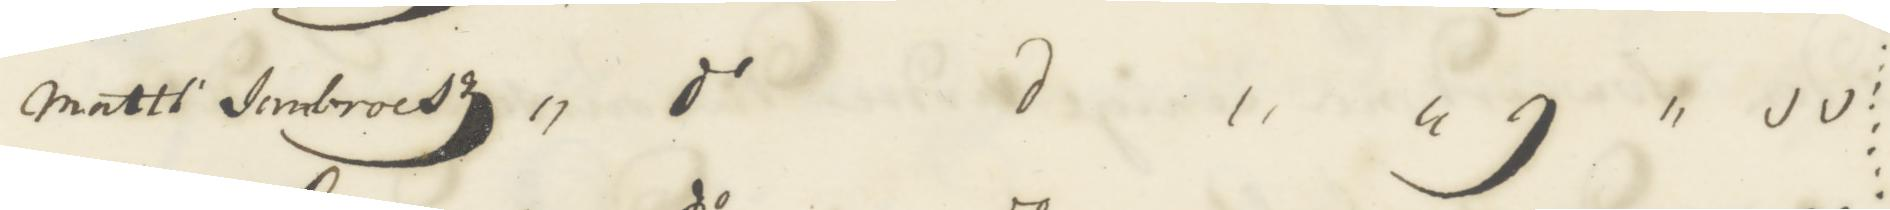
matts' Iombroesz „ do do „ „ 9 „ 10
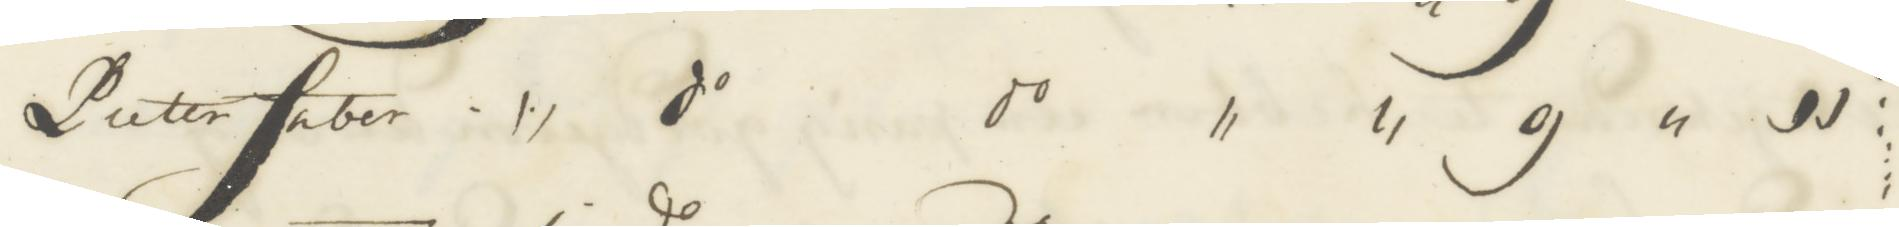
Pieter faber - „ do do „ „ 9 „ 11
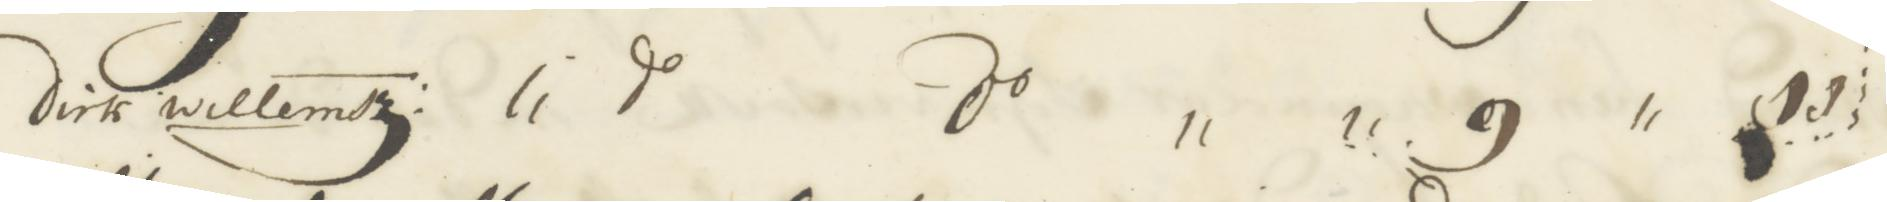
dirk willemsz: „ do do „ „ 9 „ 11
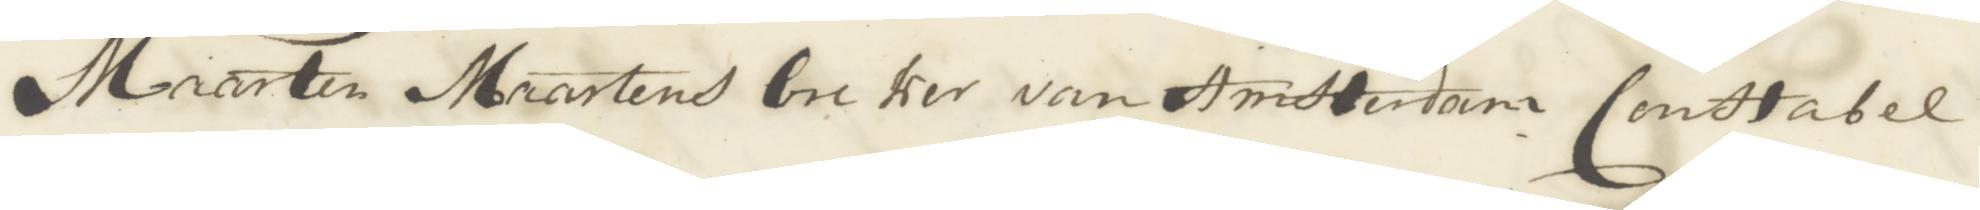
Maarten Maartens breker van Amsterdam Constabel
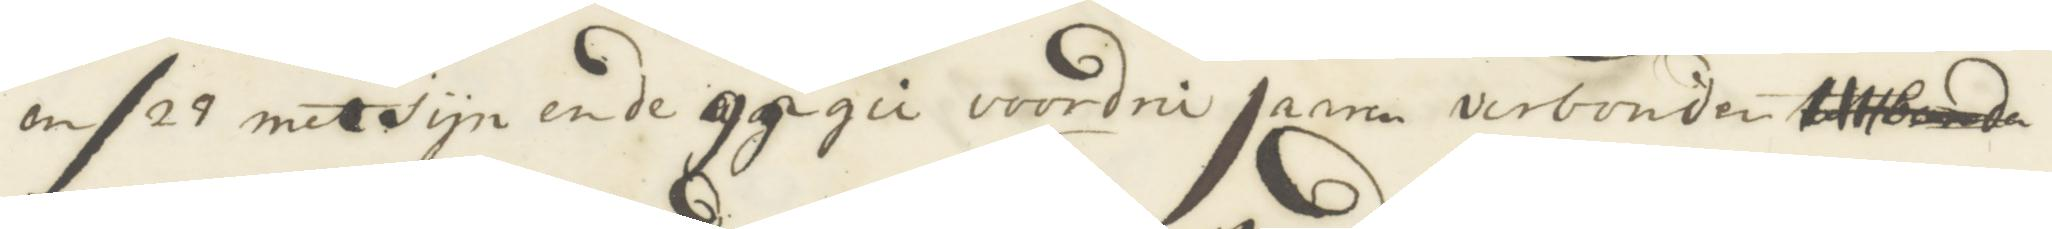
en ƒ29 met sijn en de gagie voor drie jaare verbonden verbonden
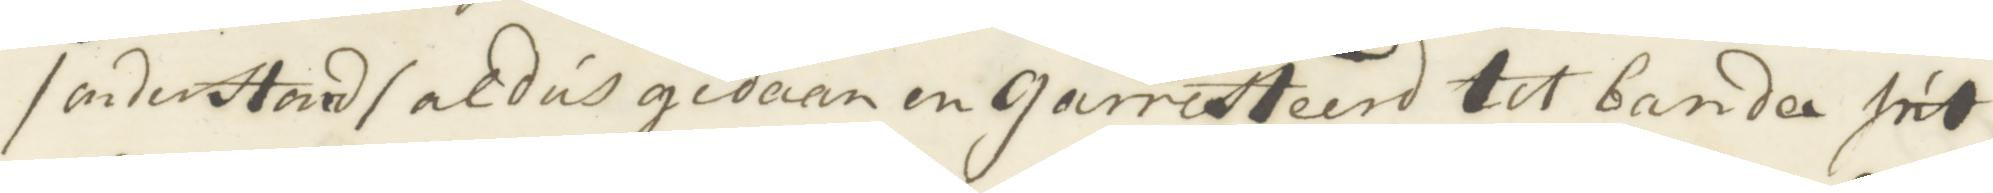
/onderstond/ aldus gedaan en g arresteerd tot banda jn't
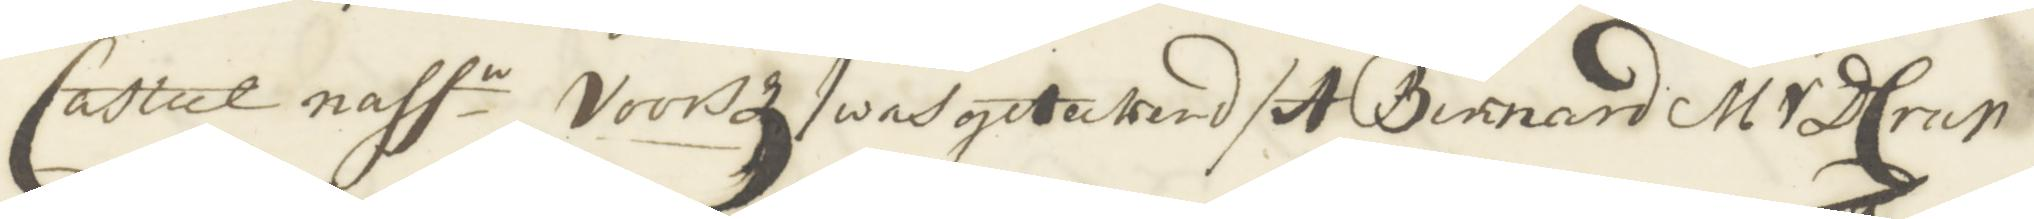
Casteel nass=w voorsz /was geteekend / A Bernard M V DCrup
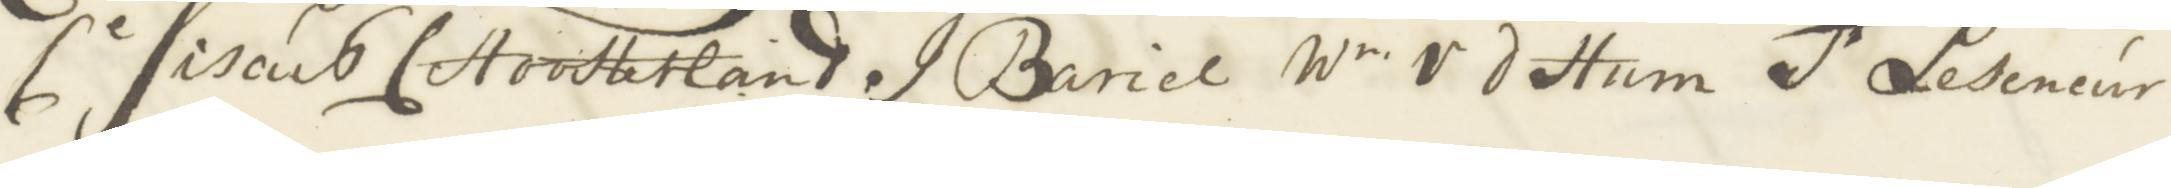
Ce fiscus C A oosterland J Bariel W:m V d Hum T Leseneur
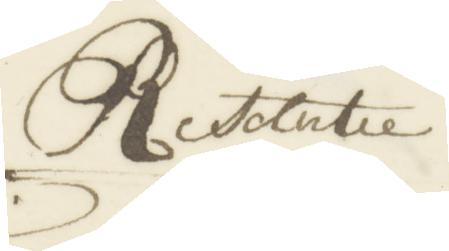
Resolutie
